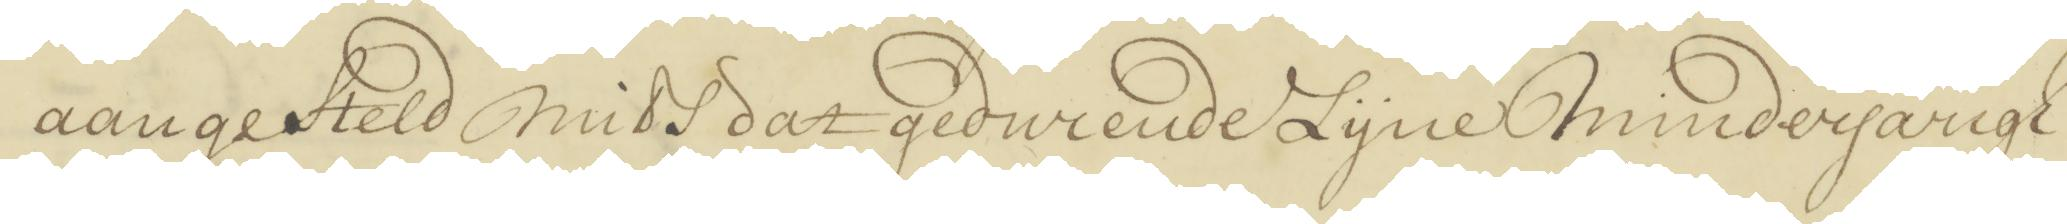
aangesteld mits dat gedurende zijne minderjarigh
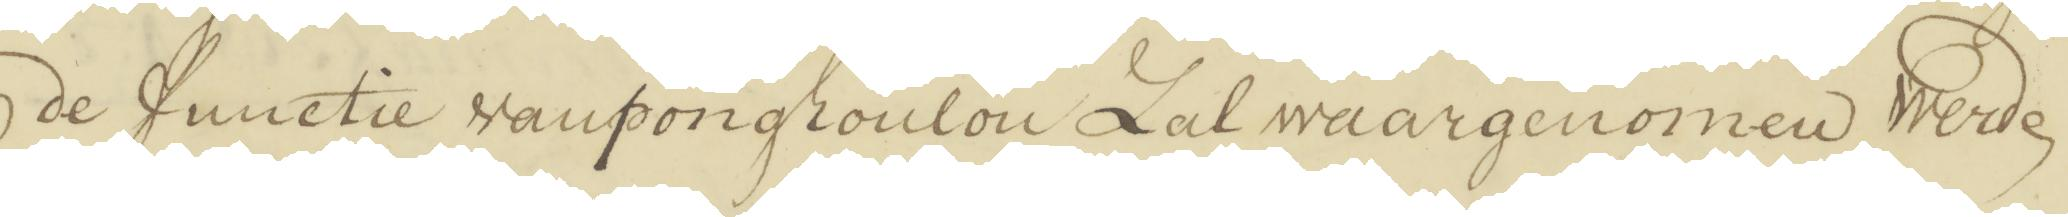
de functie van ponghoulou zal waargenomen werden
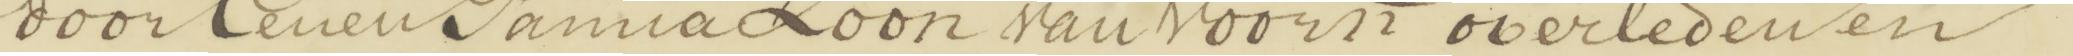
door Eenen Pamia Zoon van voorn overleden en
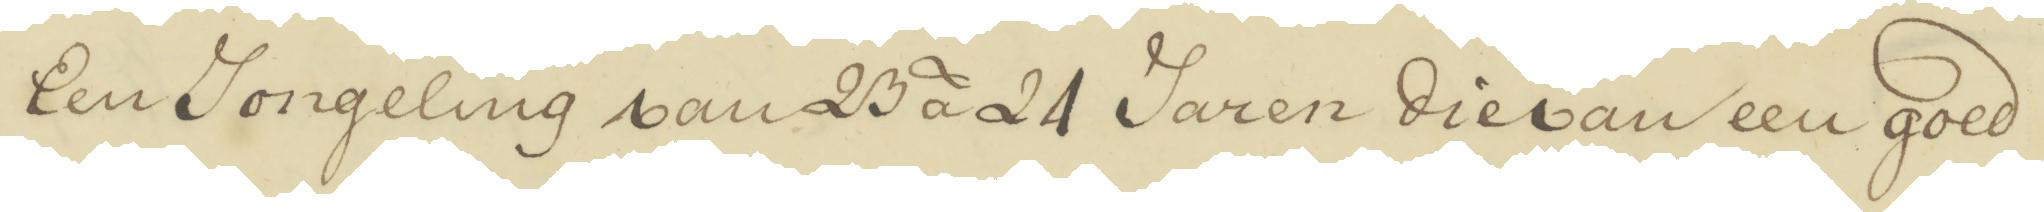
Een Jongeling van 23 â 24 Jaren die van een goed
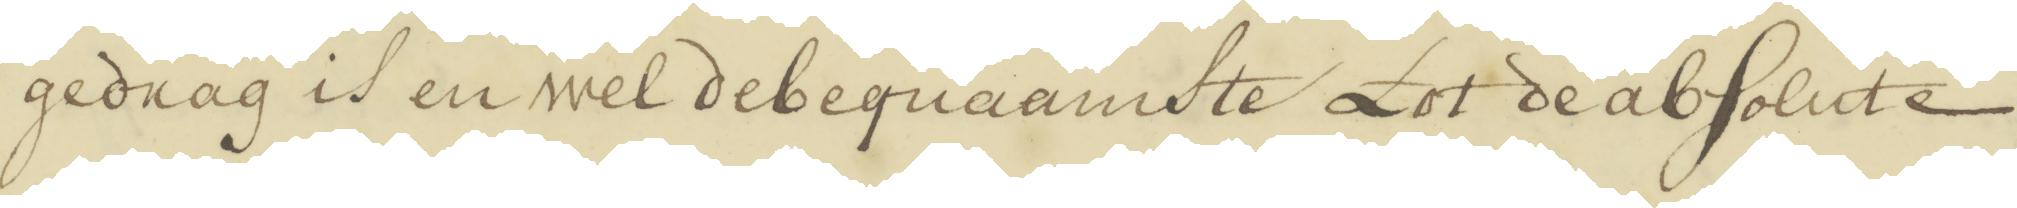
gedrag is en wel de bequaamste tot de absolute
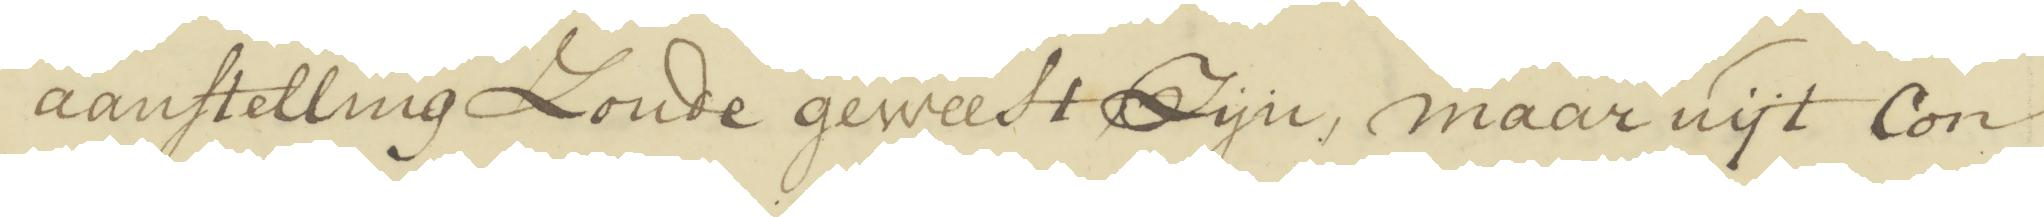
aanstelling zoude geweest zijn, maar uijt con
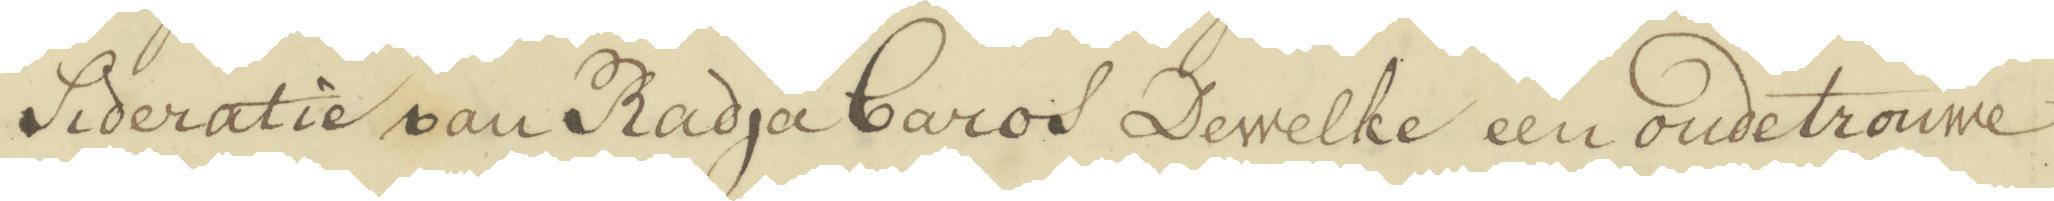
sideratie van Radja baros Dewelke een oude trouwe
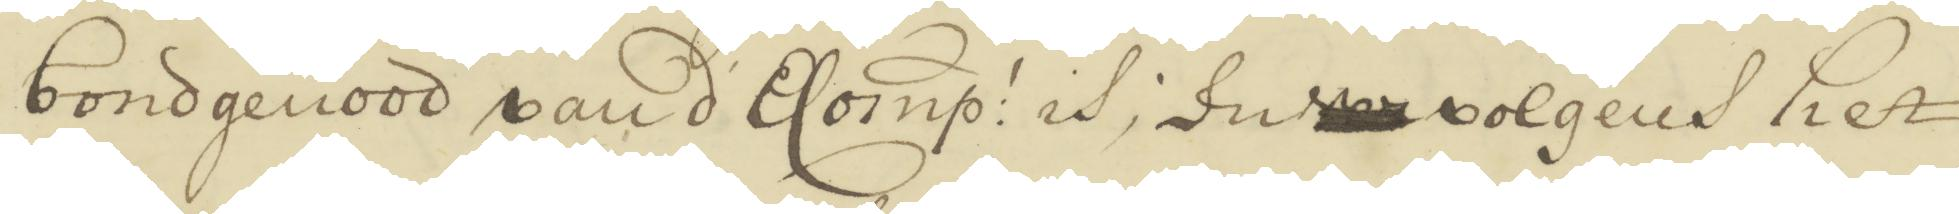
bondgenood van d' EComp:' is; En vervolgens het
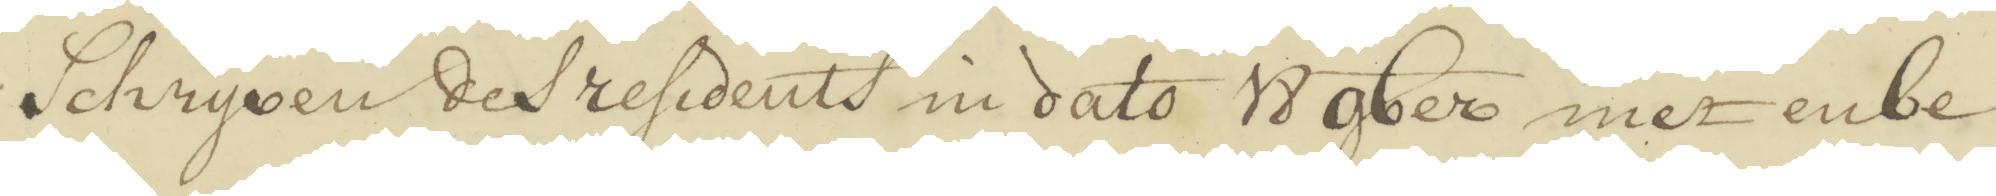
schryven des residents in dato 18 9ber met en be
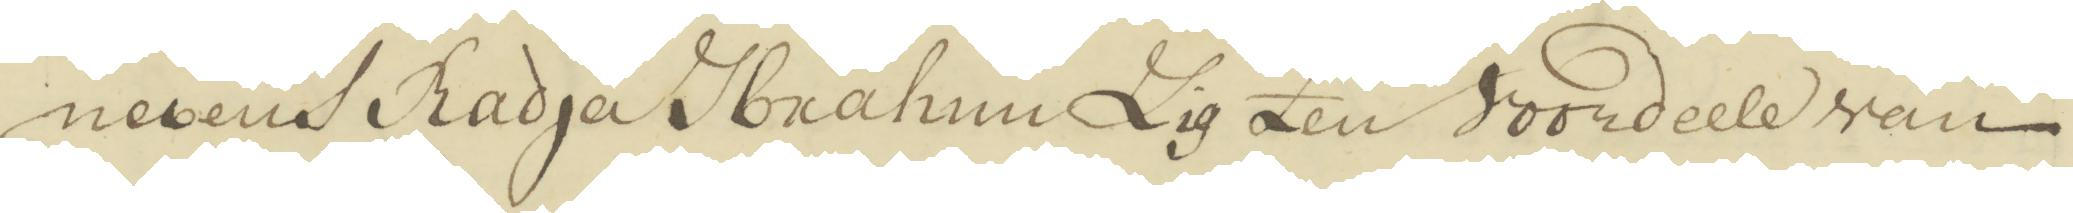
nevens Radja Ibrahim zig ten voordeele van
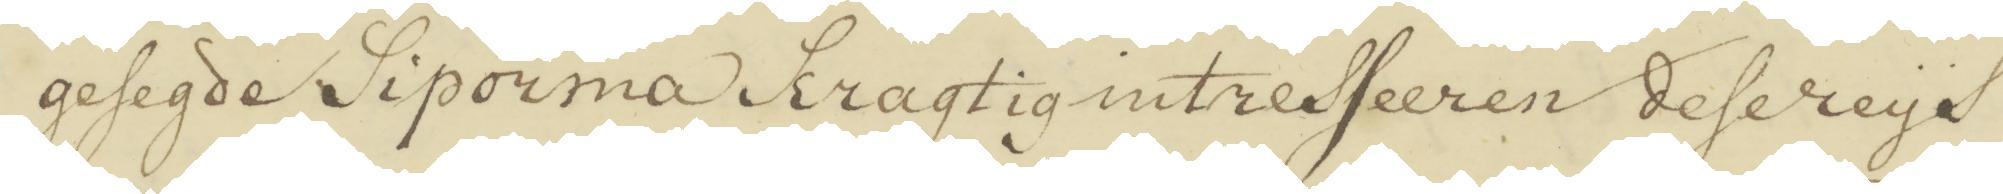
gesegde Siporma kragtig intresseeren dese reijs
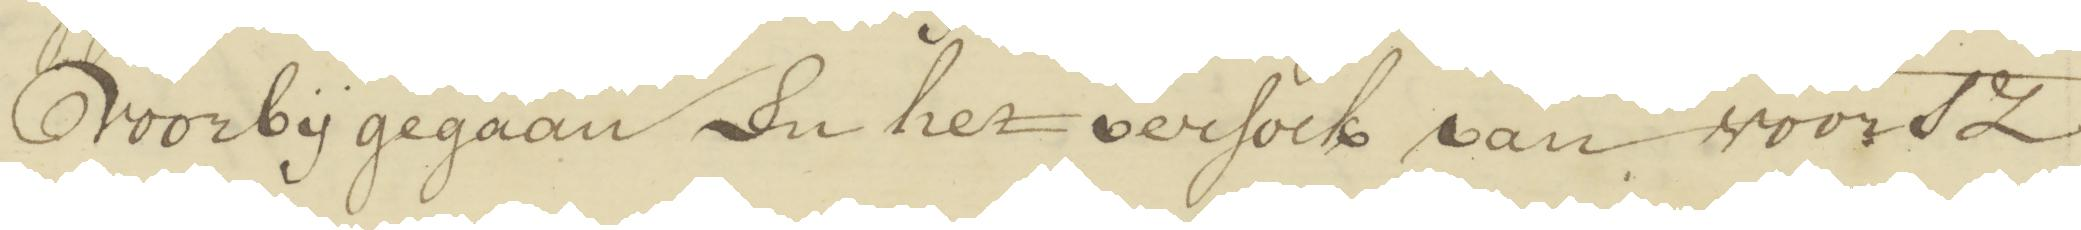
voorbij gegaan En het versoek van voorsz
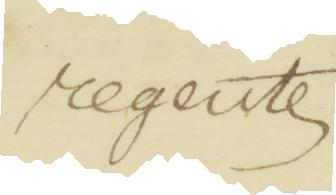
regenten
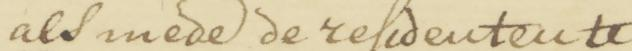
als mede de residenten te
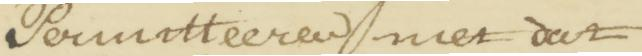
Permitteeren niet dat
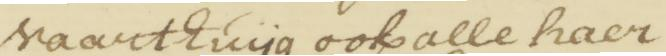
vaarthuijg ook alle haer
